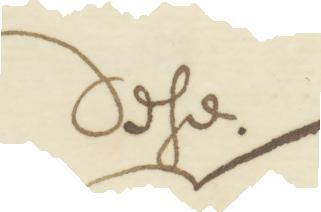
dese.
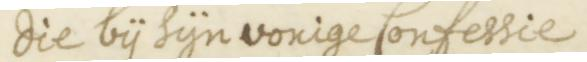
die bij sijn vorige Confessie
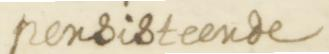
persisteerde
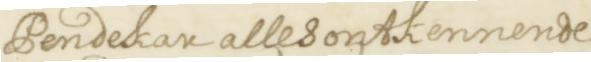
Pendekar alles ontkennende
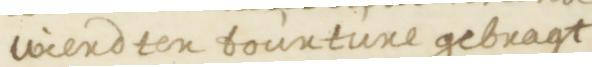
wierd ter tourture gebragt
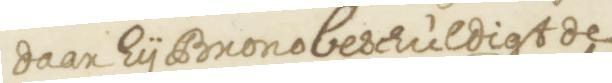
daar hij Brono beschuldigt de
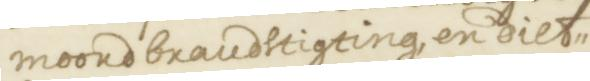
moord brandstigting en dief„
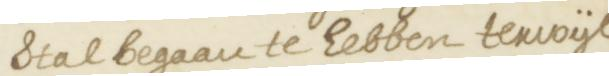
stal begaan te hebben terwijl
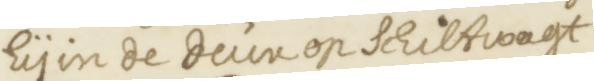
hij in de deur op schiltwagt
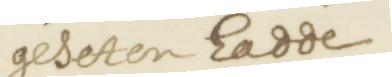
geseten hadde
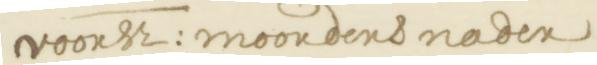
voorsz: moorders nader
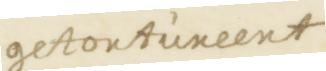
getortureert
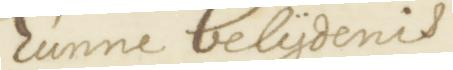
hunne belijdenis
